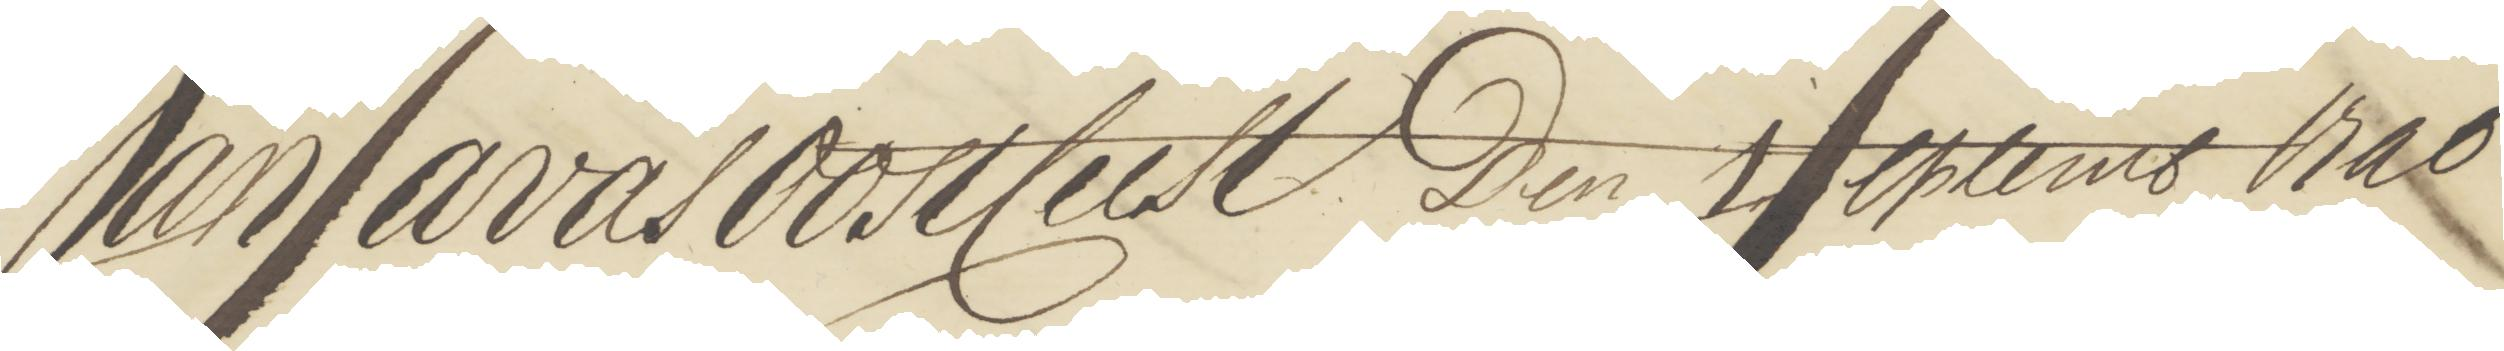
Van Javas oost Cust Den 1 Septemb 1740
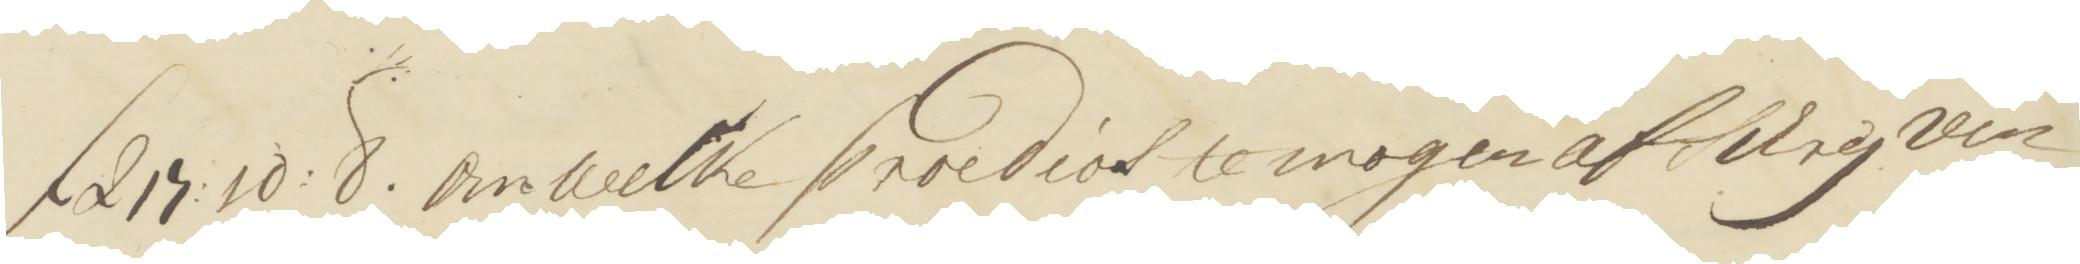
ƒ217: 10: 8. om welke proedios te mogen afschrijven
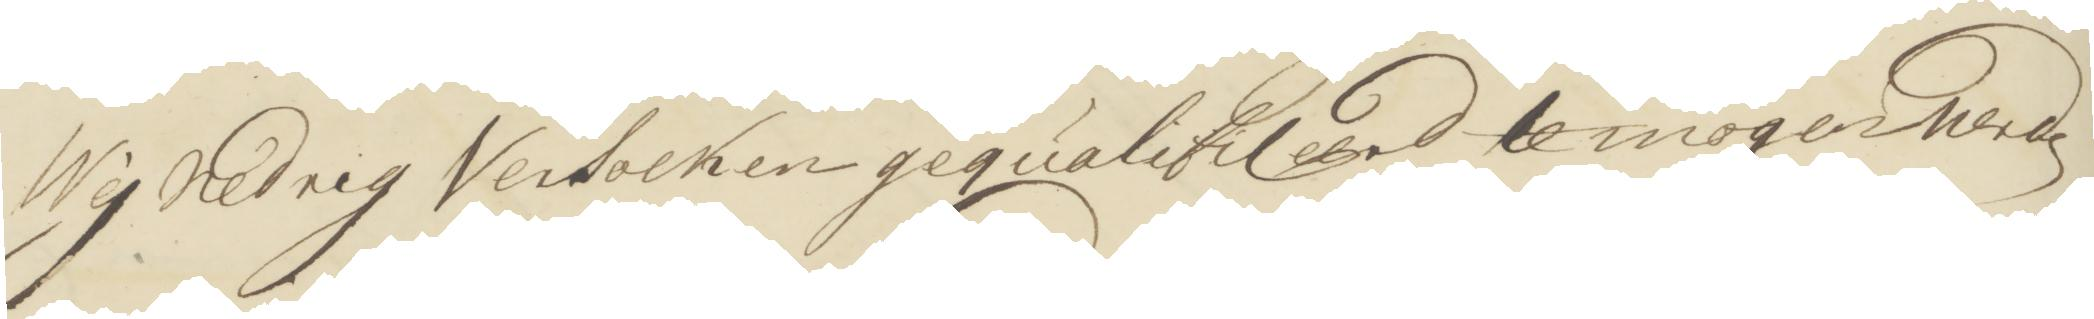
wij nedrig versoeken gequalificeerd te mogen werden
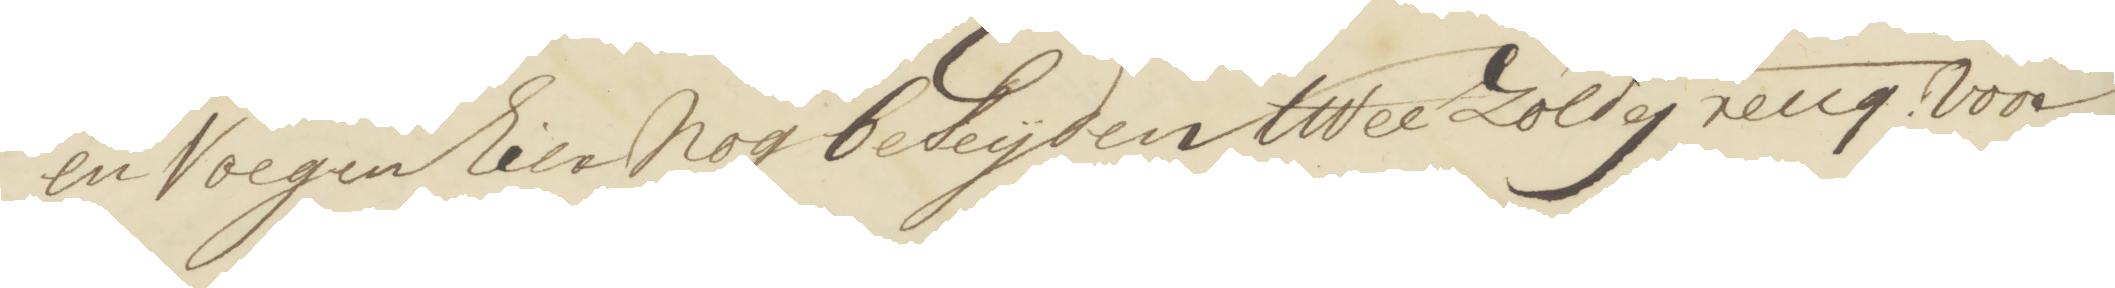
en voegen hier nog beseijden twee zoldij reecq: voor,
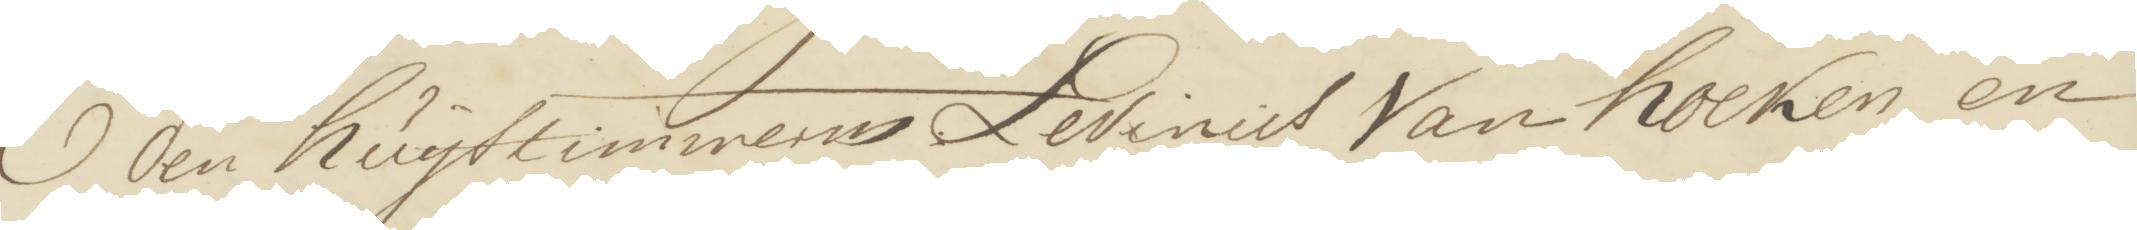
den huijstimmerm: Levinus van hoeken en
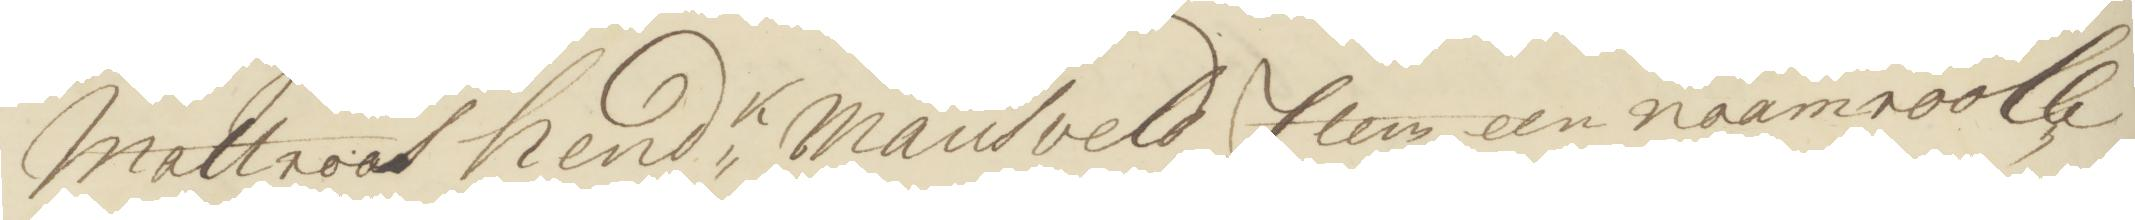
mattroos hend„k mansveld Jtem een naamroolle„
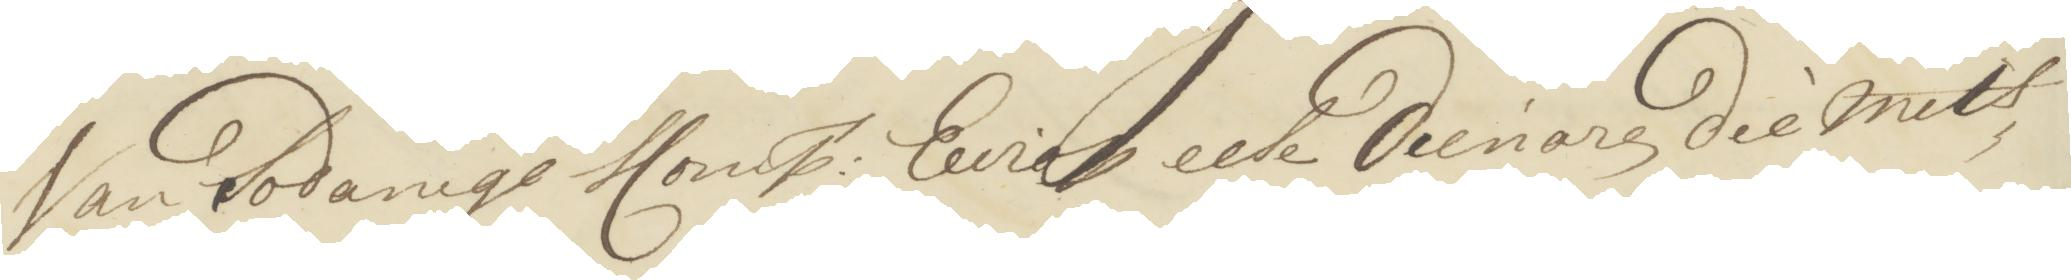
van sodanige sComp:s Europeese dienaren die mits„
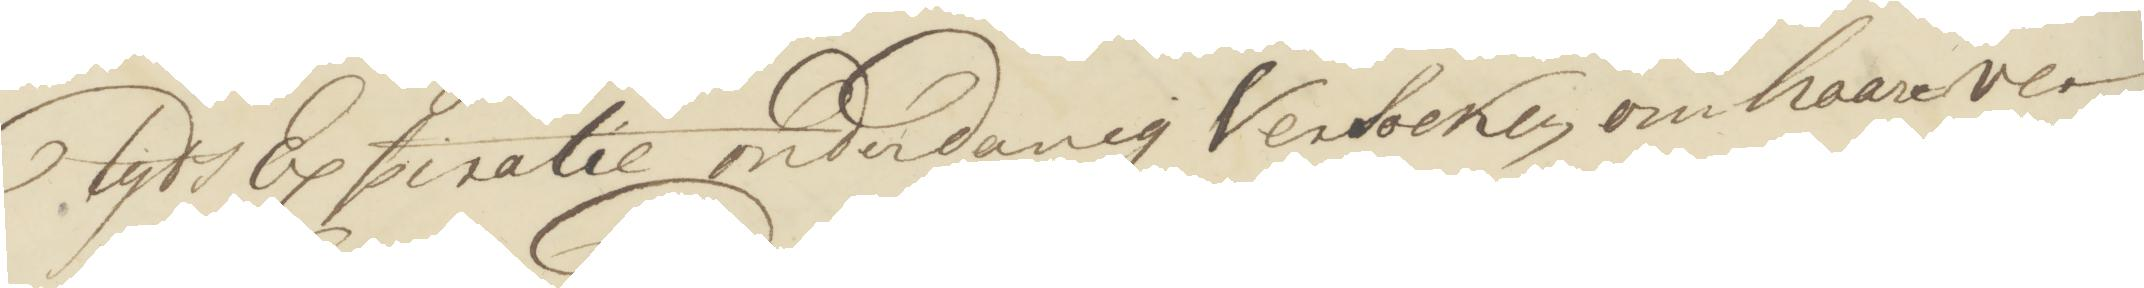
tijts Expiratie onderdanig versoeken om haare ver
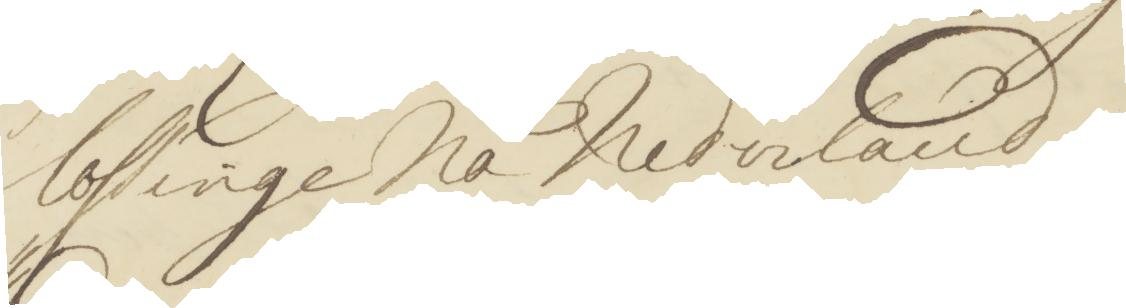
lossinge na Nederland.
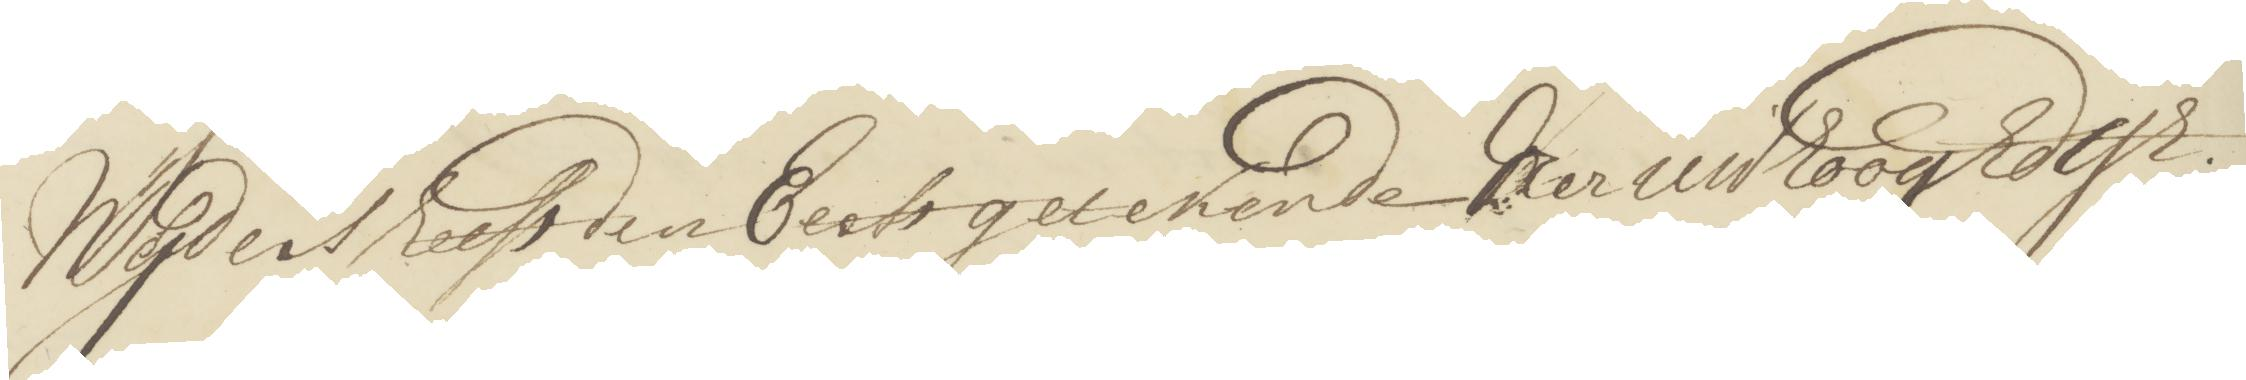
Wyders heeft den Eerst getekende dier uw hoog Edelh:
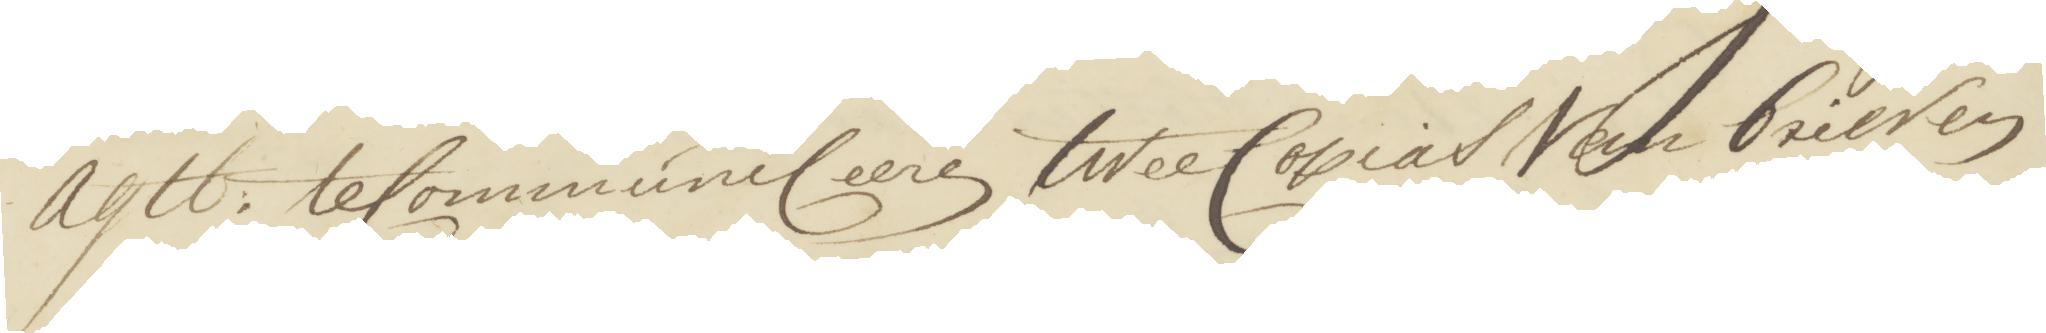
agtb: te communiceeren twee Copias van brieven
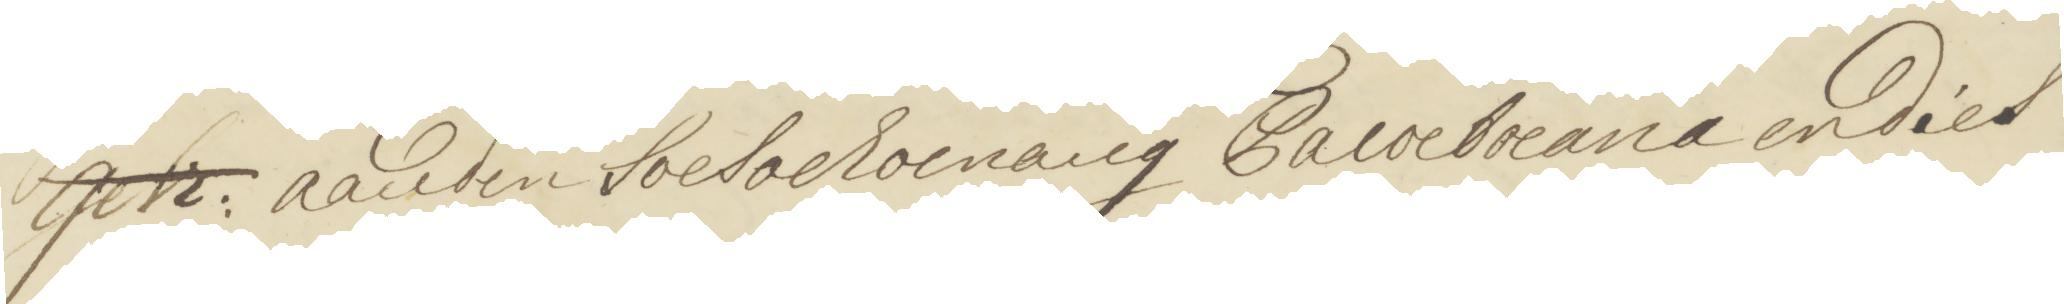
gesz: aanden soesoehoenang Pacoeboeana en dies
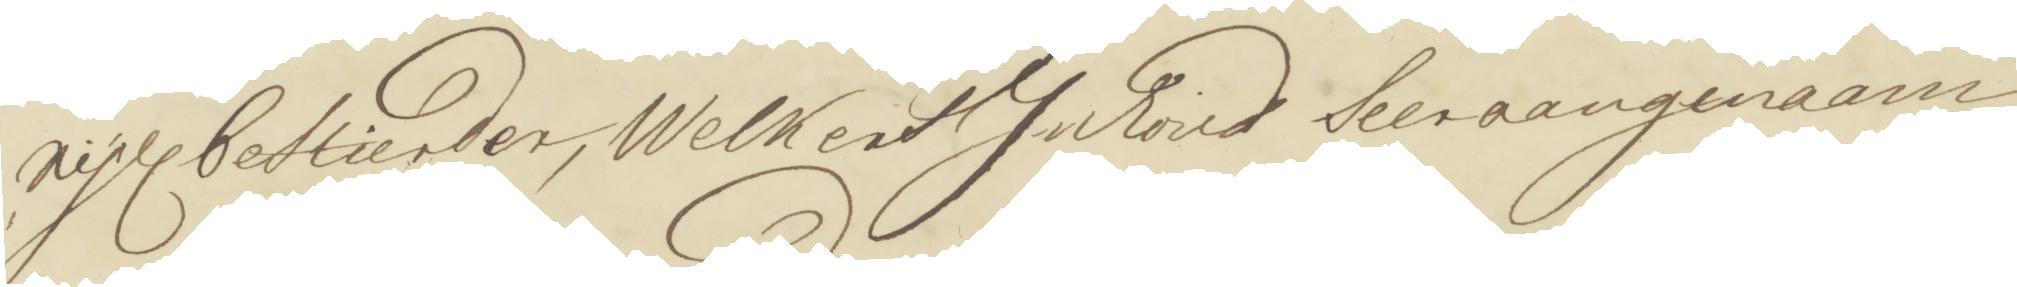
rijx bestierder, welkers Jnhoud seer aangenaam
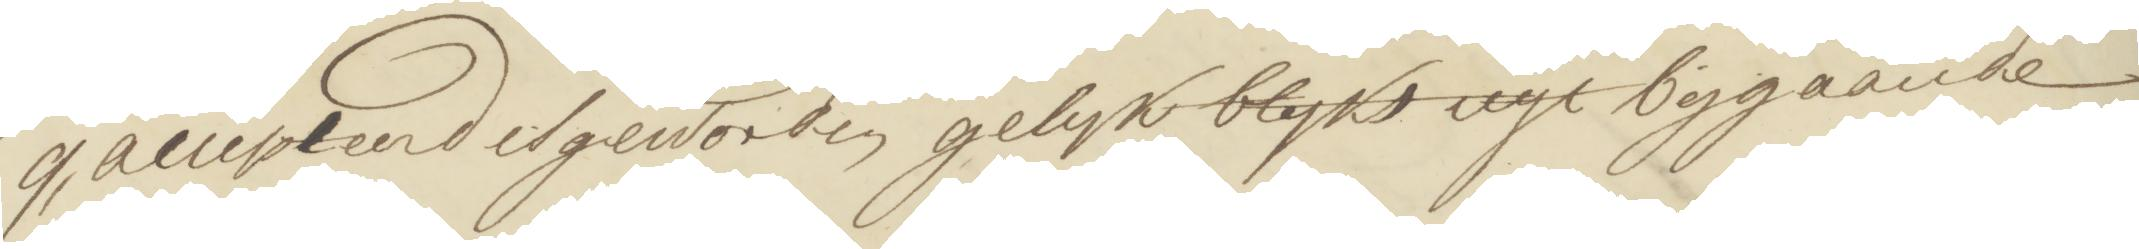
g,accepteerd is geworden gelyk blykt uyt bijgaande
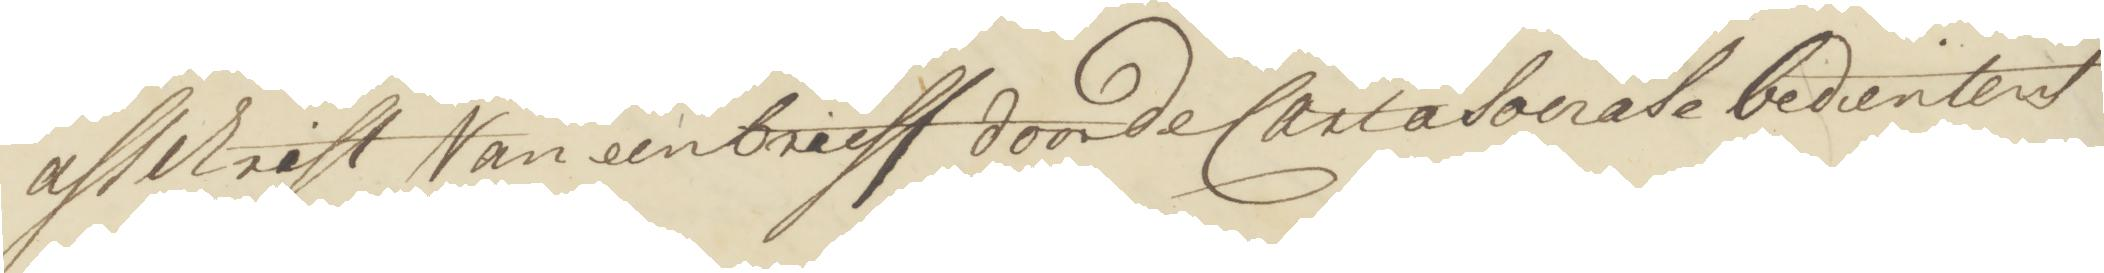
afschrift van een brieff door de Cartasoerase bedientens
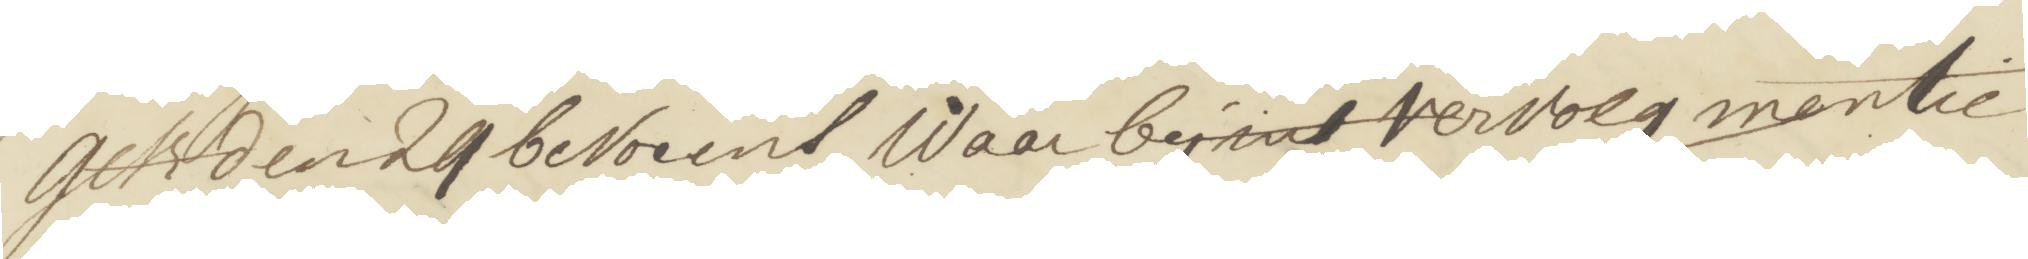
gesz den 24 bevorens, waar bij int vervolg mentie
